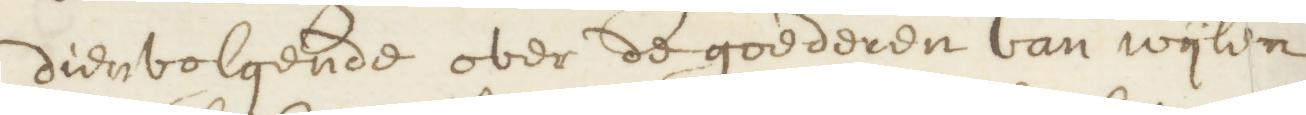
dienvolgende over de goederen van wijlen
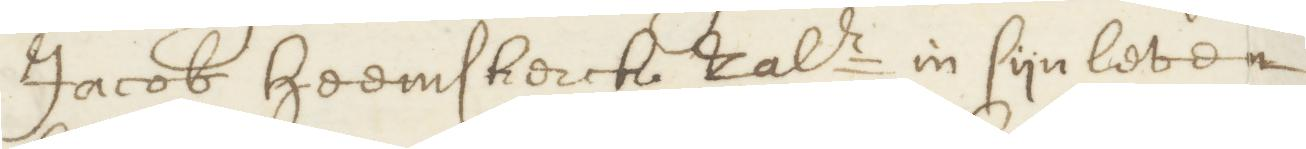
Jacob heemskerck zal=r in sijn leven
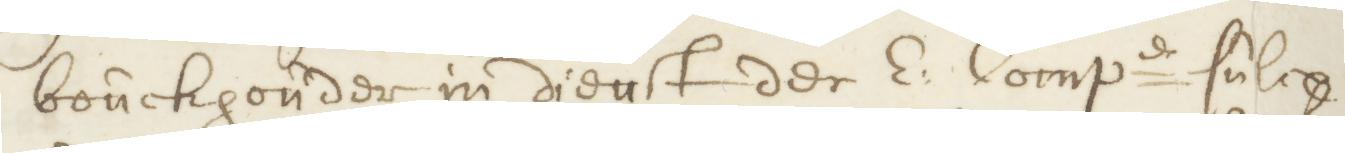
bouckhouder in dienst der E: Comp=e sulcx
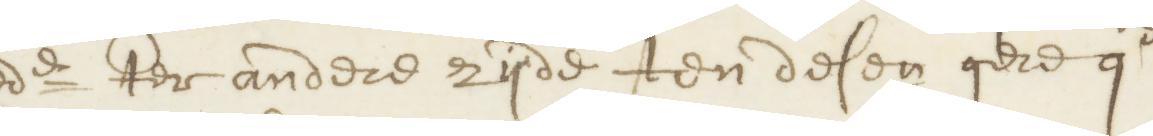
ged=e ter andere zijde ten desen gereq=ens
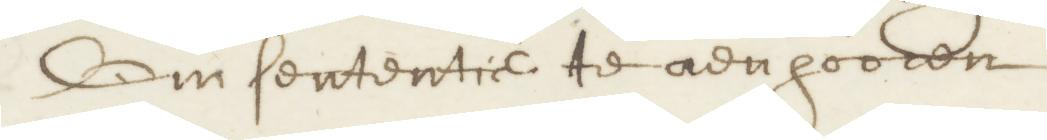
Om sententie te aenhooren
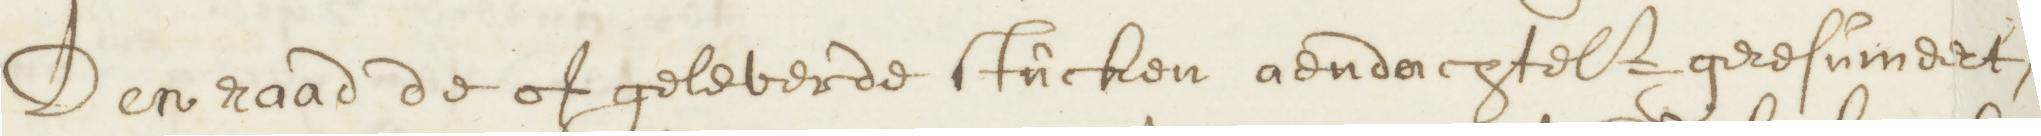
Den raad de of geleverde stucken aendachtelijk geresumeert,
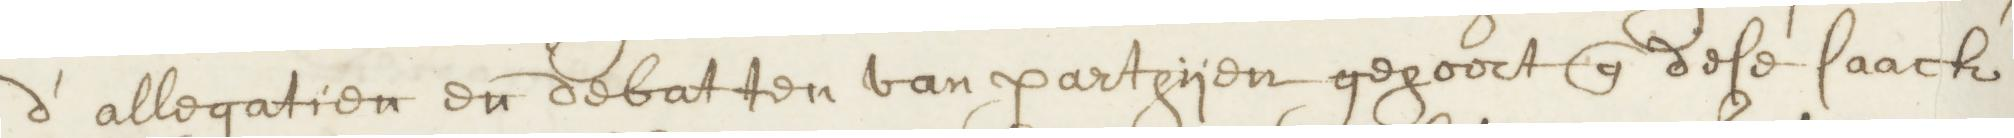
d’ allegatien en debatten van parthijen gehoort ende dese saack
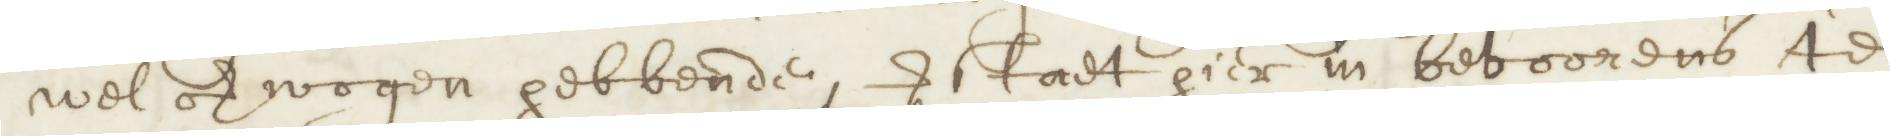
wel overwogen hebbende verstaet hier in bevoorens te
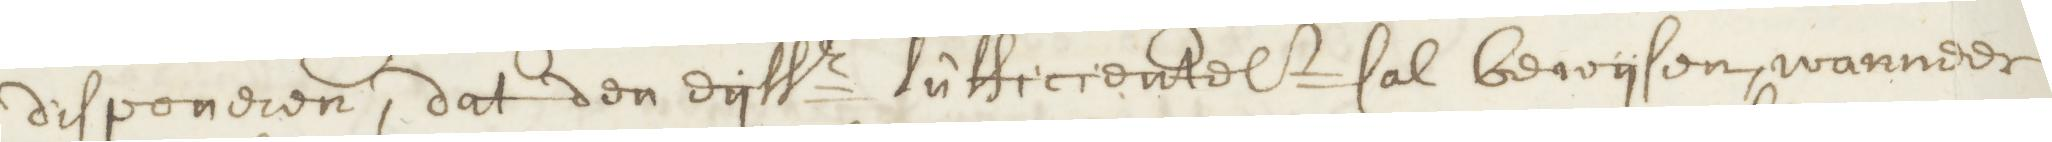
disponeren, dat den eijss=r sufficientelijk sal bewijsen, wanneer
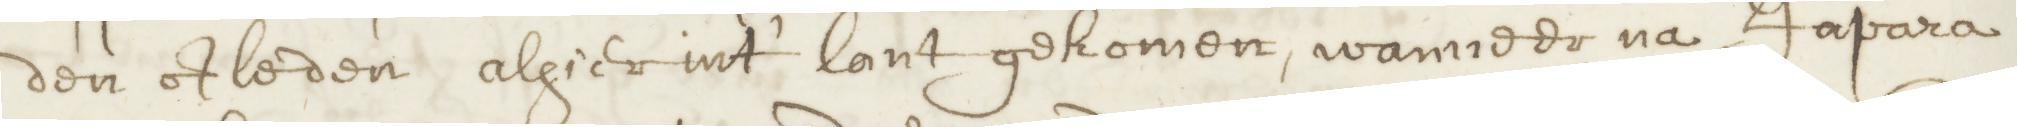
den overleden alhier int lant gekomen, wanneer na Japara
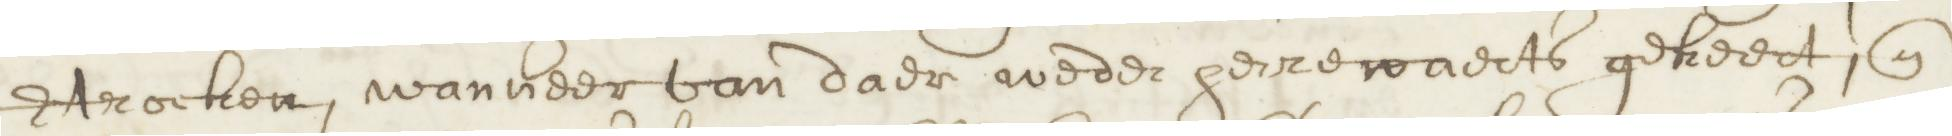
vertrocken, wanneer van daer weder herrewaerts gekeert; ende
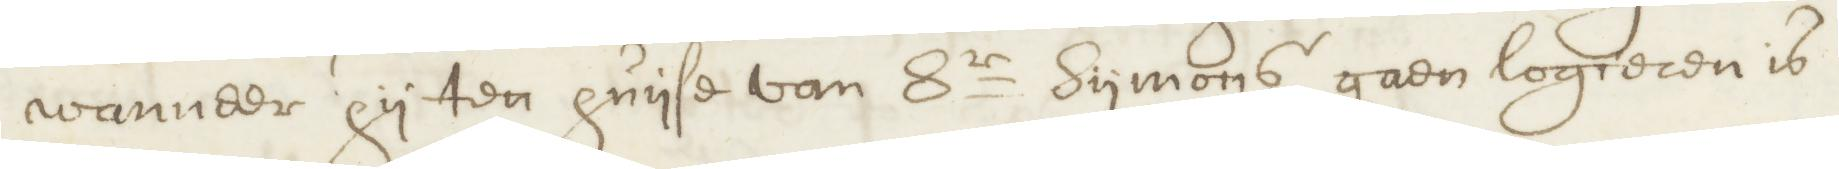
wanneer hij ten huijse van H=r Sijmons gaen logieren is
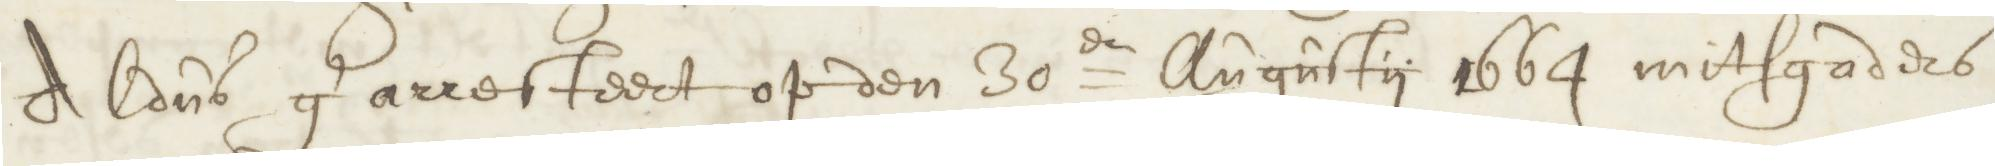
Aldus g’ arresteert op den 30=en Augustij 1664 mitsgaders
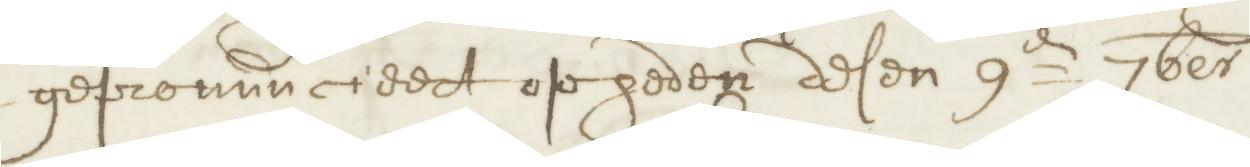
gepronuncieert op heden desen 9=e 7ber
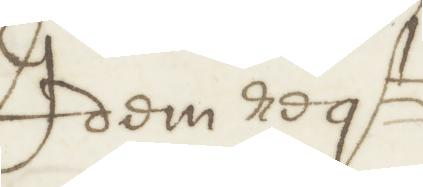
Jdem req=t
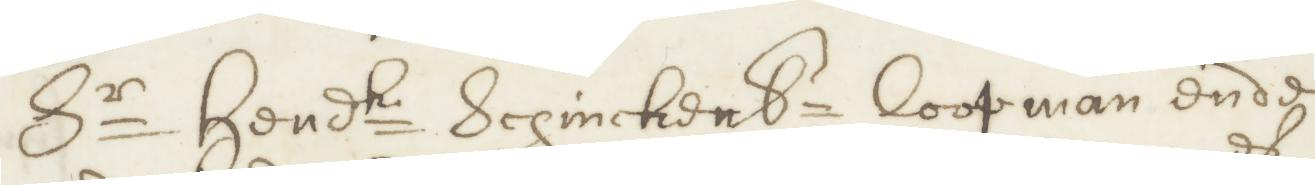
H=r hend=k schinckenb= Coopman ende
